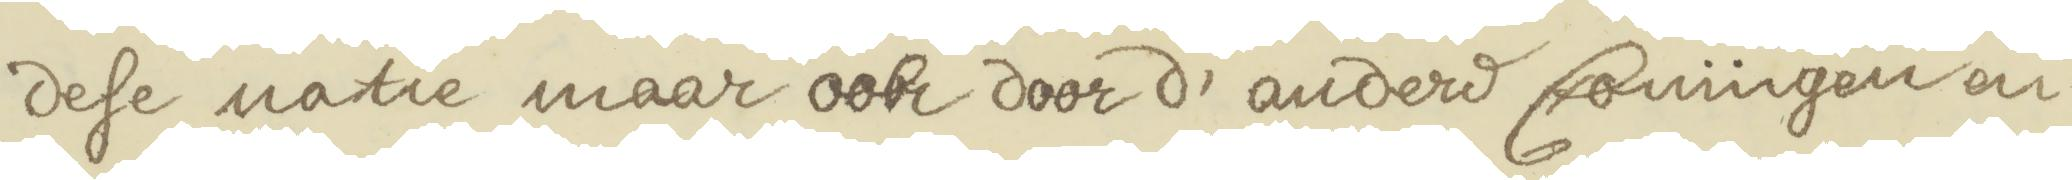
dese natie maar ook door d’ andere Coningen en
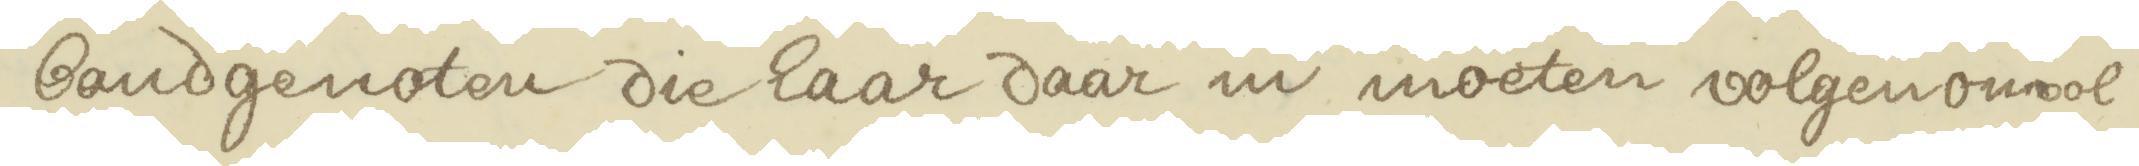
bandgenoten die haar daar in moeten volgen onvol
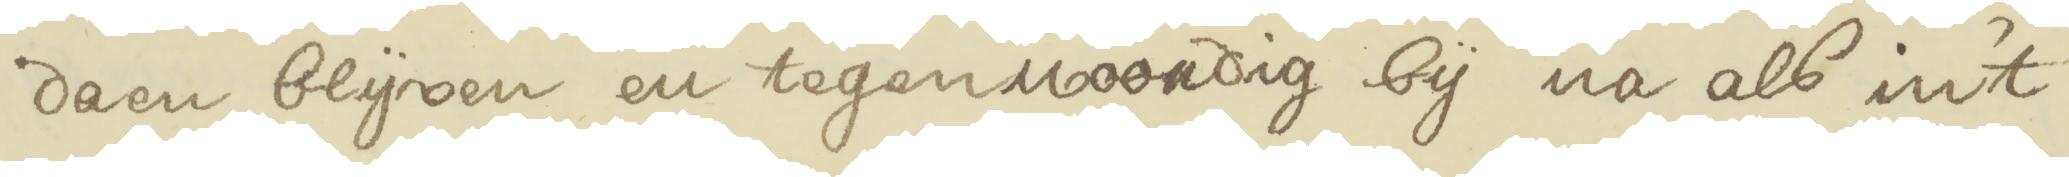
daen blijven en tegenwoordig bij na als in ’t
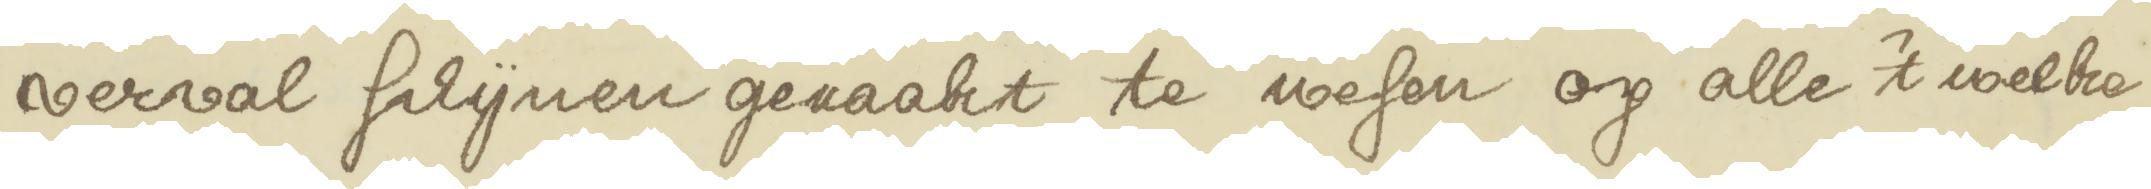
verval schijnen geraakt te wesen op alle ’t welke
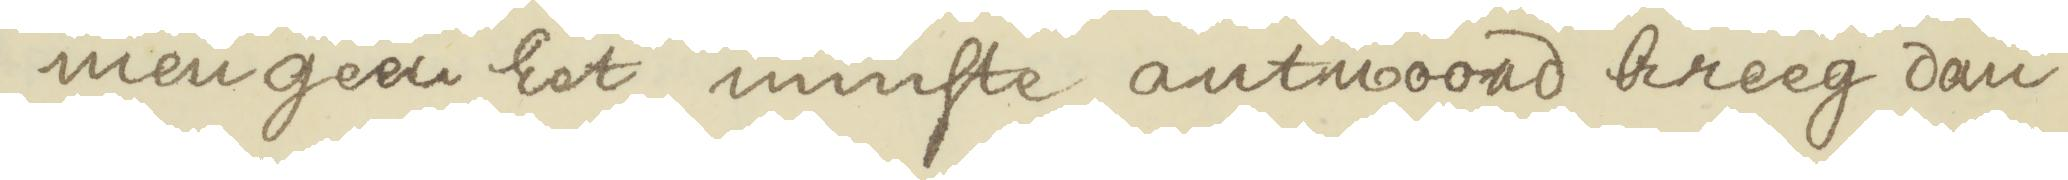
men geen het minste antwoord kreeg dan
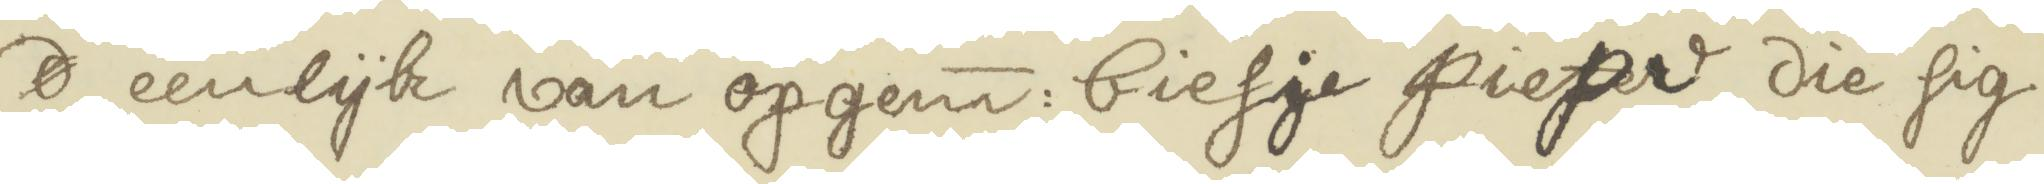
d eenlijk van opgem: biesje piepere die sig
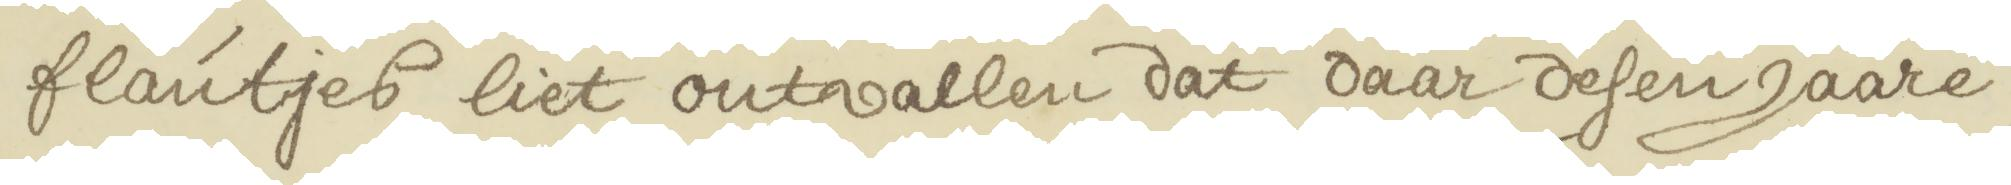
flautjes liet ontvallen dat daar desen jaare
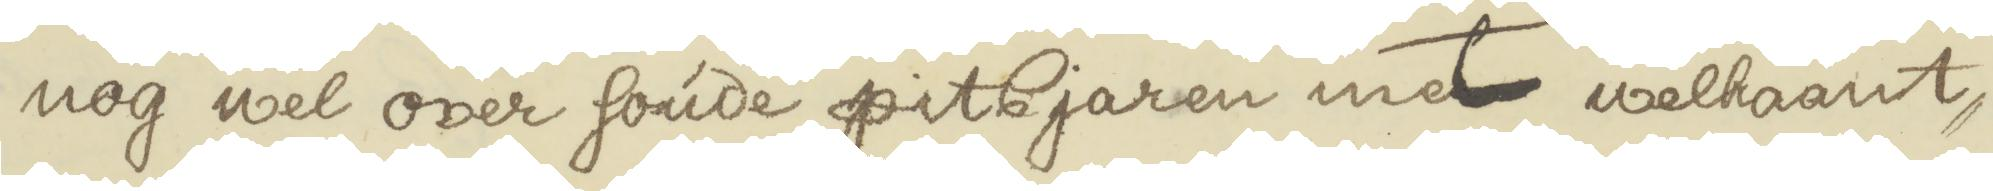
nog wel over soude pitsjaren met welkaant„
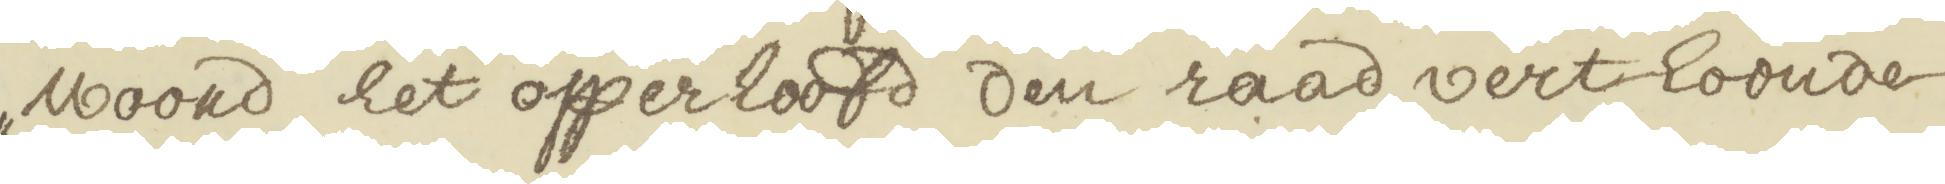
woord het opperhoofd den raad verthoonde
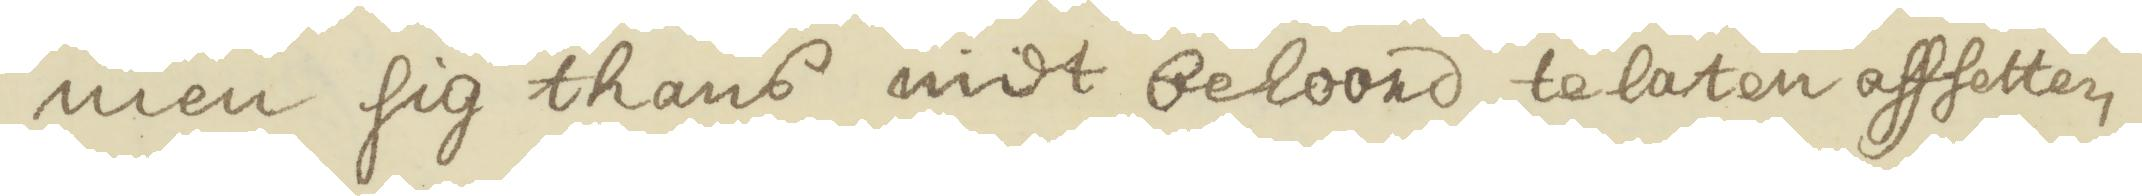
men sig thans niet behoord te laten affsetten
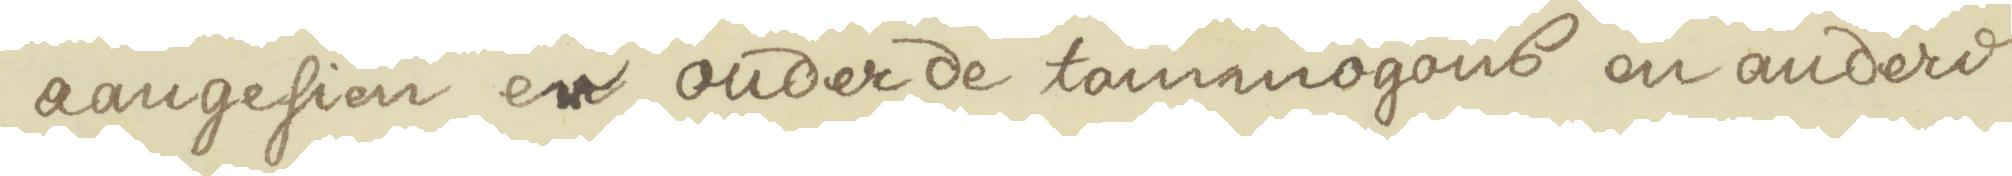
aangesien er onder de tommogons en andere
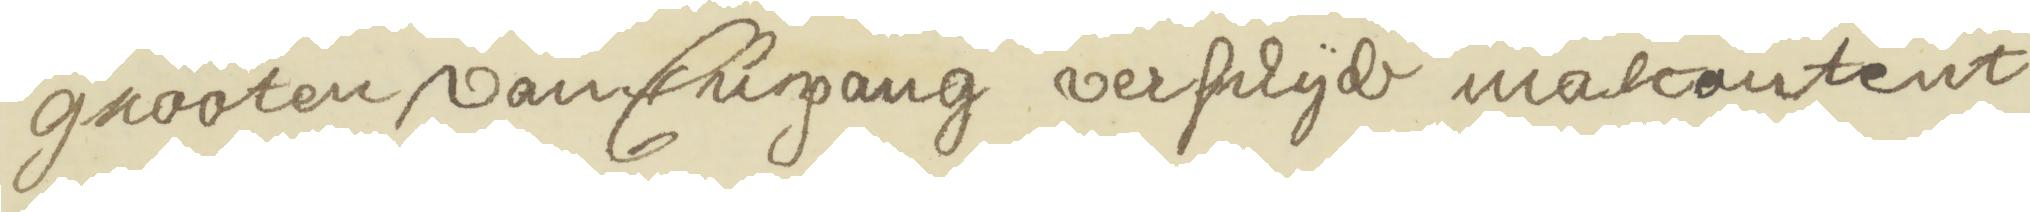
grooten van Cupang verschijde malcontent
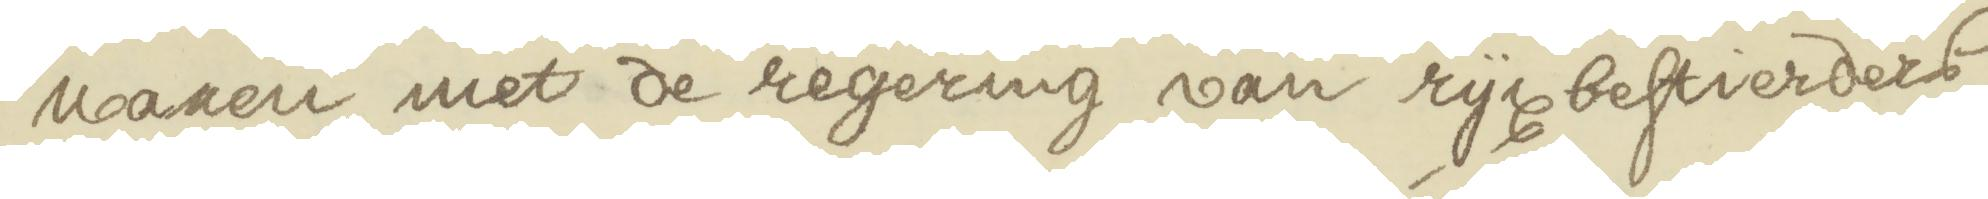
waren met de regering van rijxbestierders
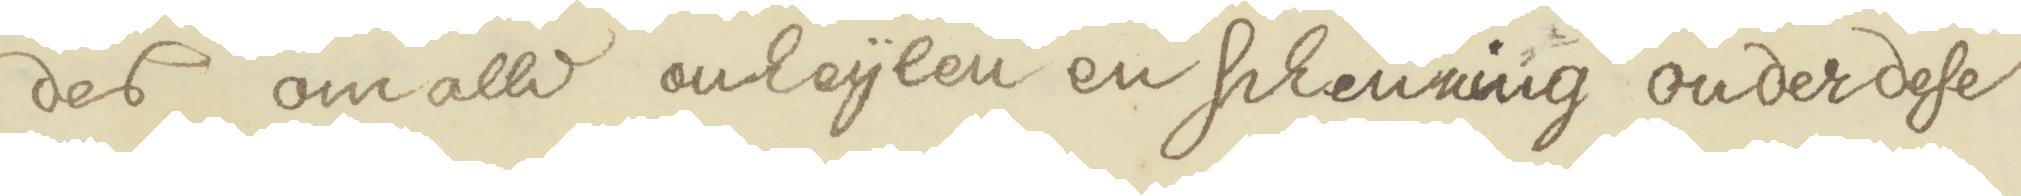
des om alle onheijlen en scheuring onder dese
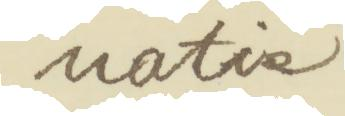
natie
